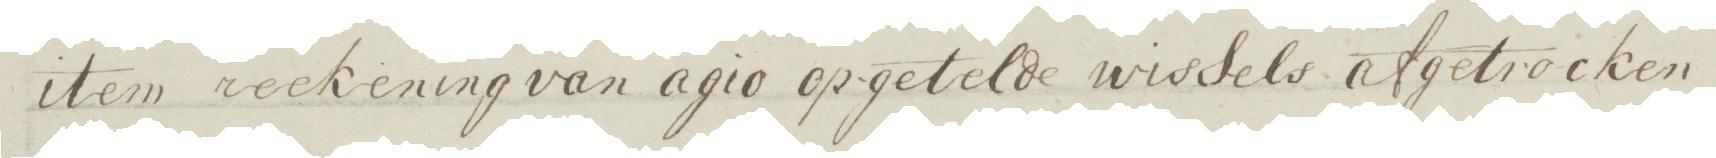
item reekening van agio op getelde wissels afgetrocken
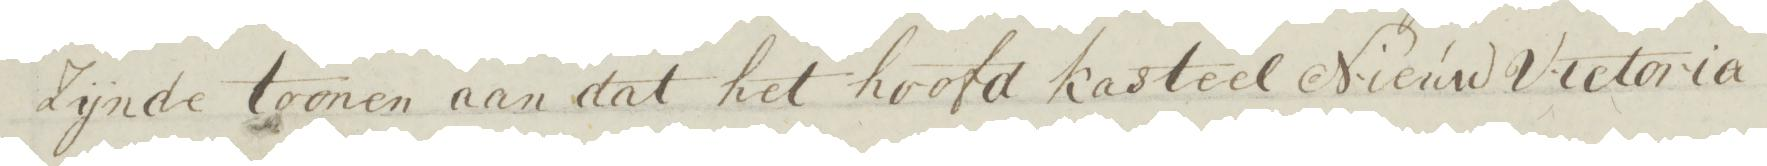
zijnde toonen aan dat het hoofd kasteel Nieuw Victoria
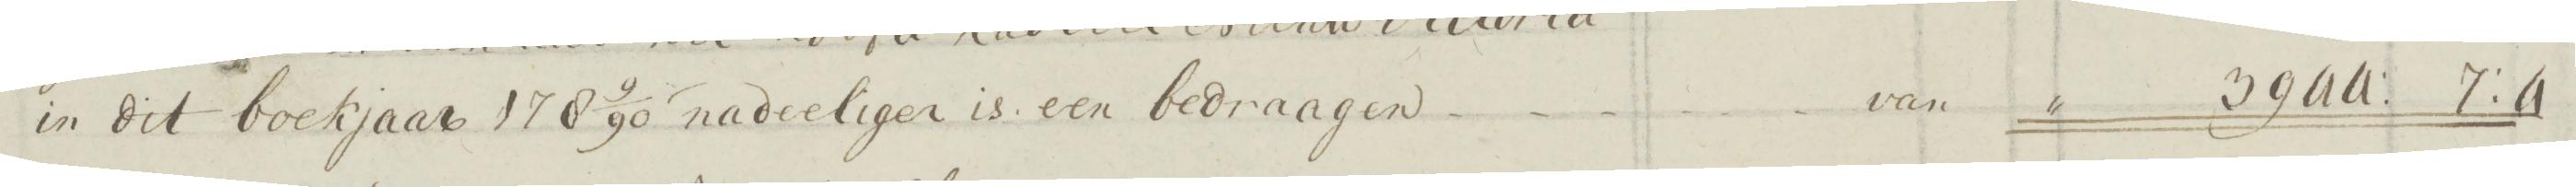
in dit boekjaar 178 9/90 nadeeliger is een bedraagen - - - - - van „ 3944: 7:4
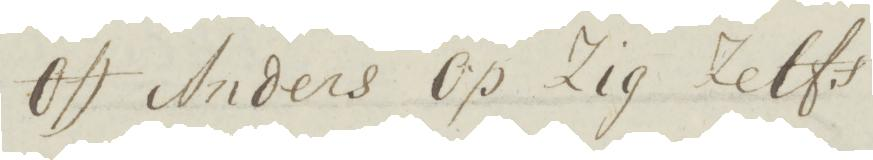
off Anders op zig zelfs
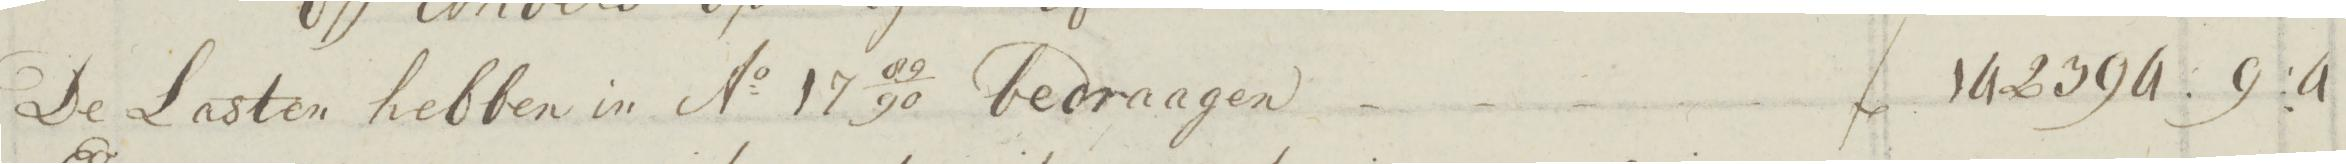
De Lasten hebben in A=o 17 89/90 bedraagen ƒ 142394: 9:4
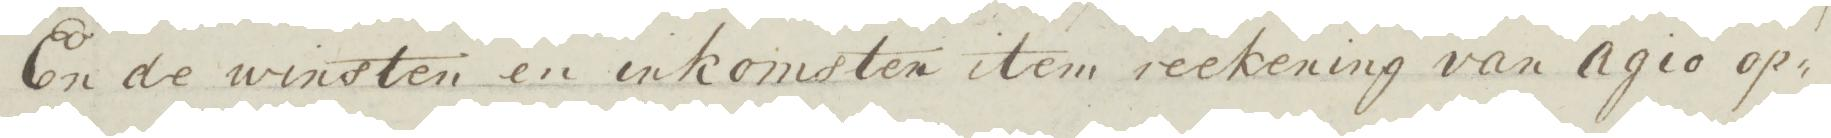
En de winsten en inkomsten item reekening van agio op„
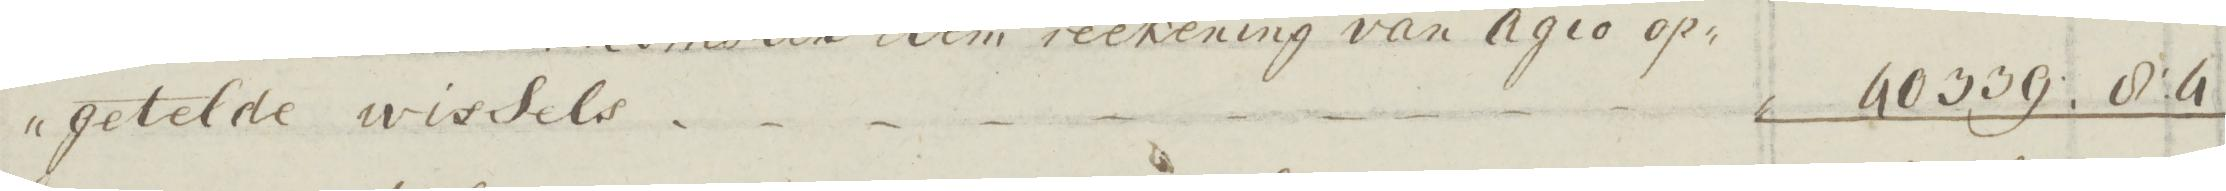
„getelde wissels - - - - - - - - - - „ 40339: 8:4
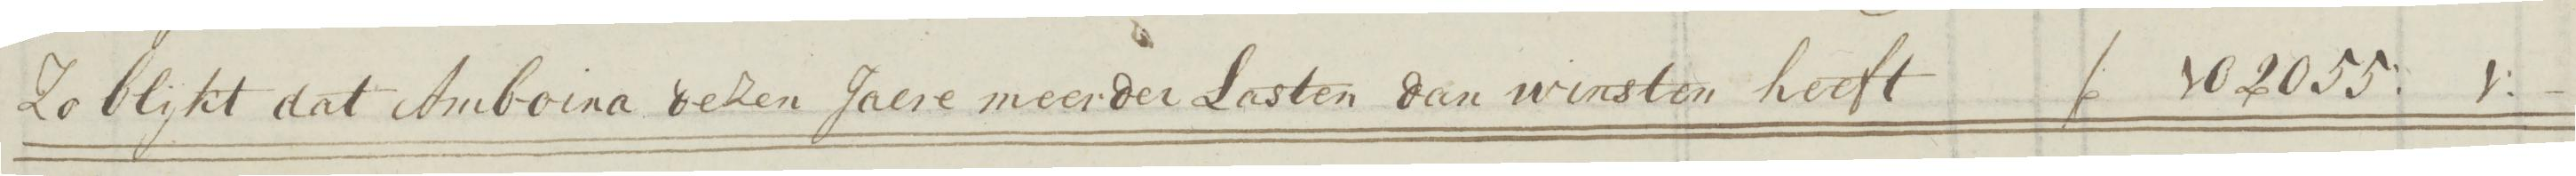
Zo blijkt dat Amboina dezen Jaere meerder Lasten dan winsten heeft ƒ 102055: 1:-
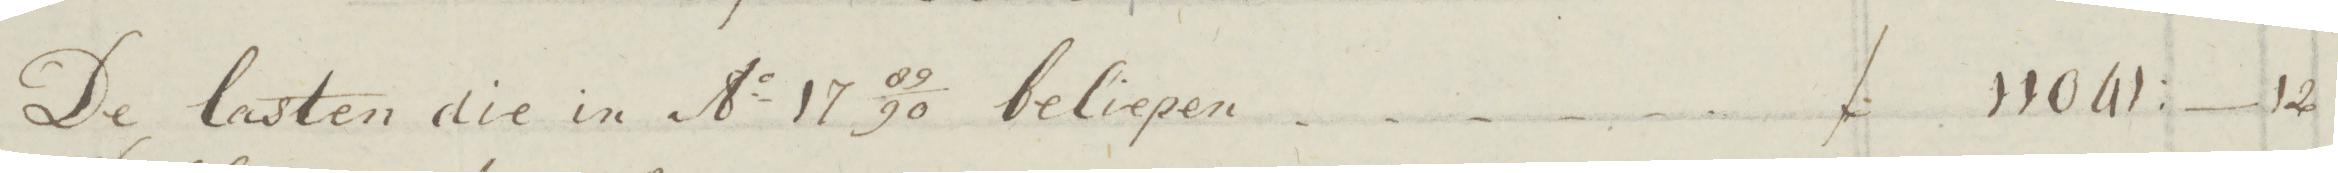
De lasten die in A=o 17 89/90 beliepen - - - - - - ƒ 11041:—12
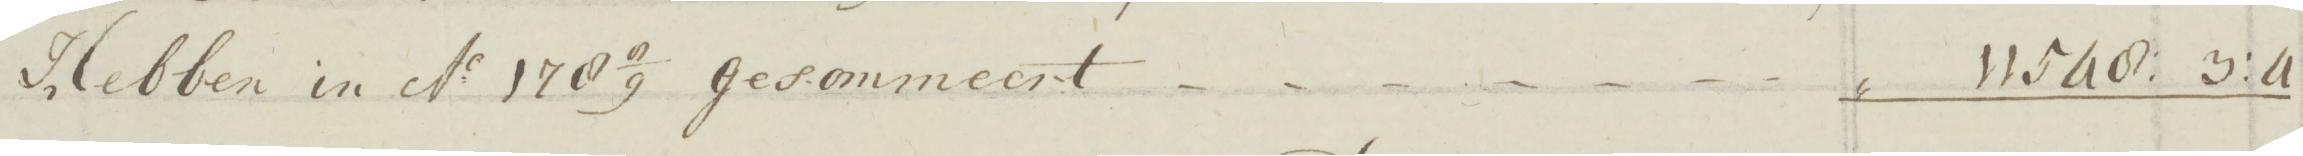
Hebben in A=o 178 8/9 gesommeert - - - - - - - „ 11548: 3:4
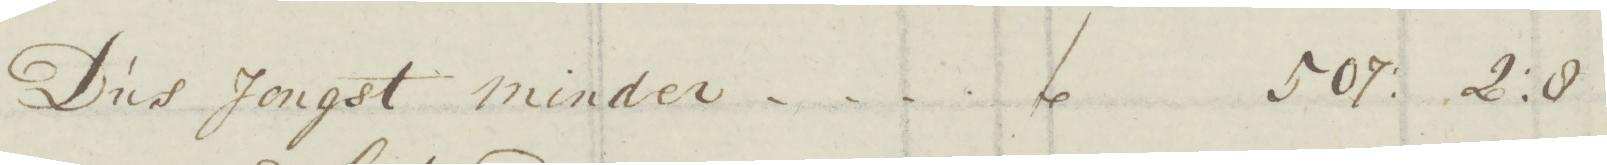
Dus Jongst minder - - - ƒ 507: 2:8
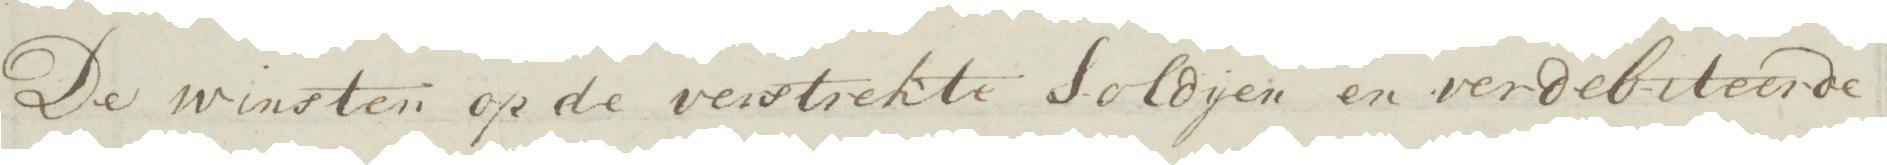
De winsten op de verstrekte soldijen en verdebiteerde
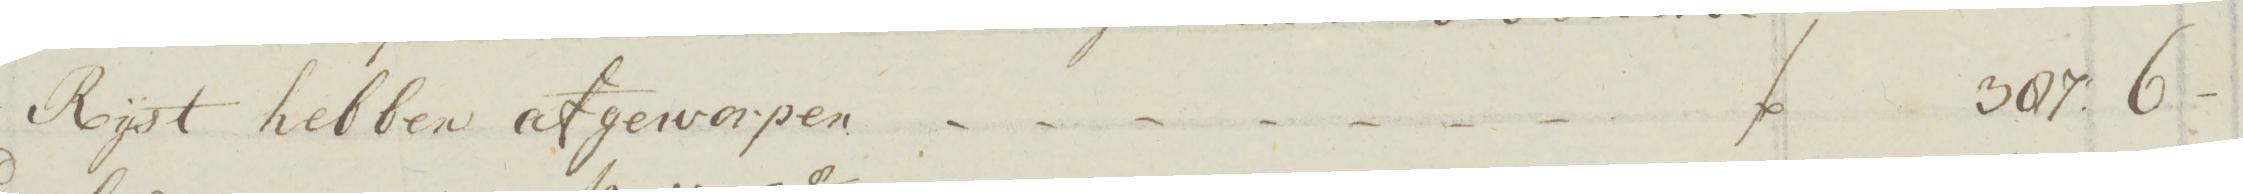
Rijst hebben afgeworpen - - - - - - - - ƒ 387: 6:-
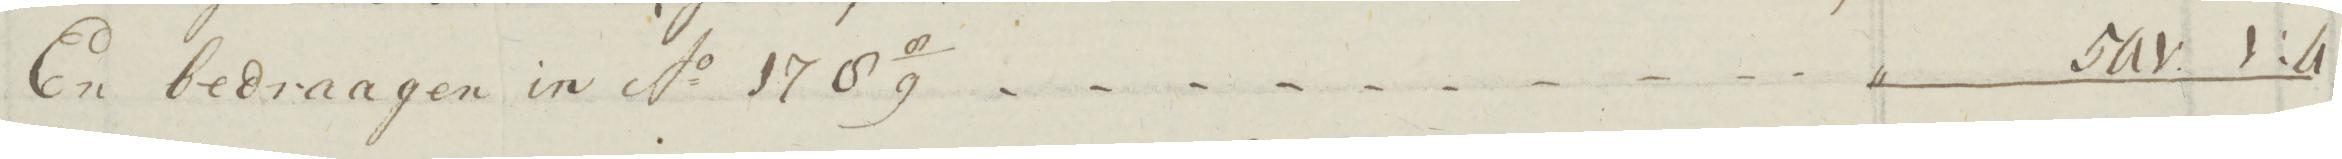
En bedraagen in A=o 178 8/9 - - - - - - - - - - „ 541: 1:4
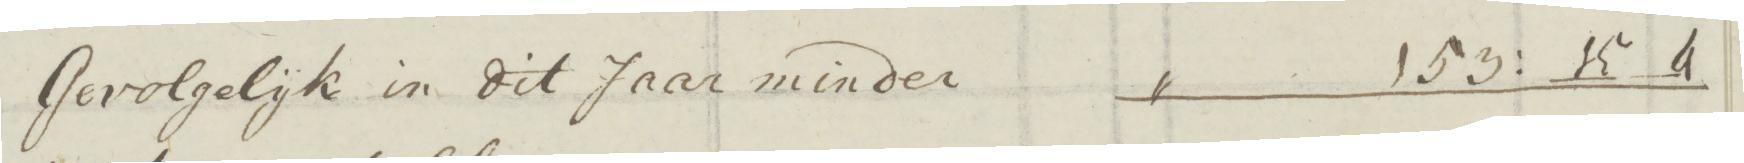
Gevolgelijk in dit Jaar minder „ 153: 15 4
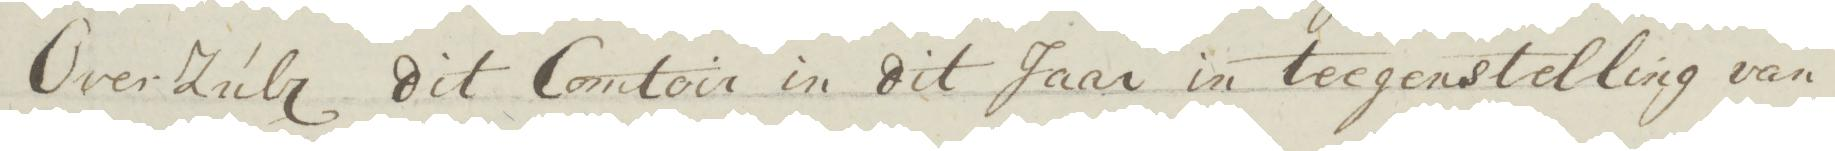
Over zulx dit Comtoir in dit Jaar in teegenstelling van
